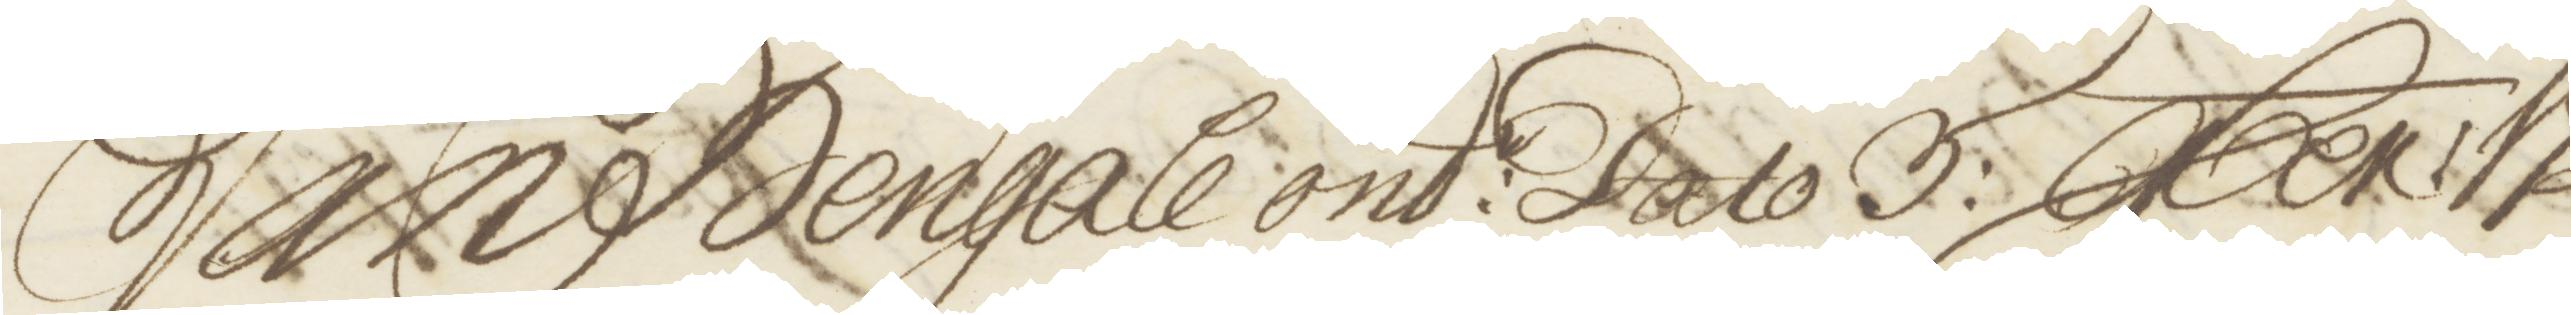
Van Bengale ond:r Dato 3:' 9ber: 1727
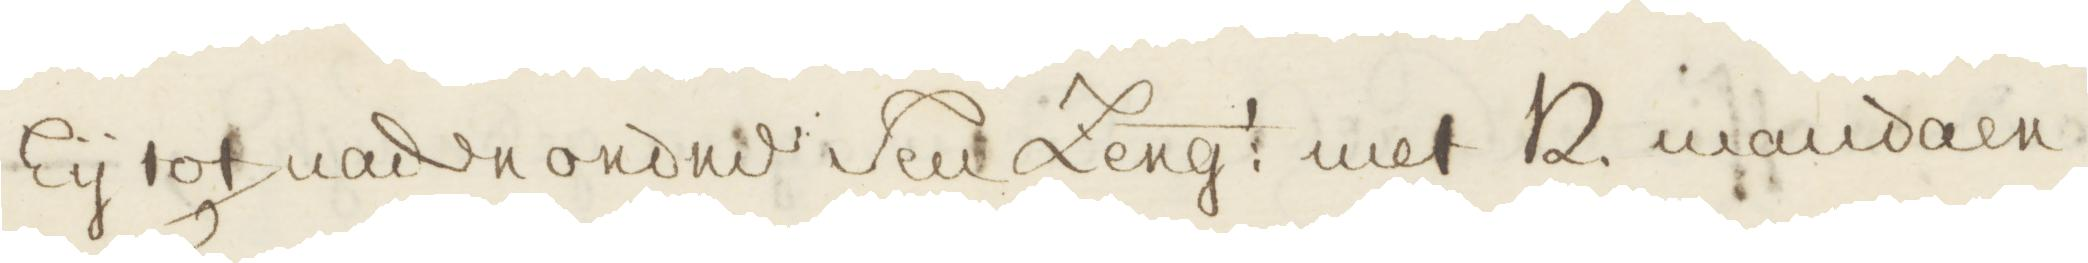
hij tot nader ordre Een Zerg:t met 12. man daer
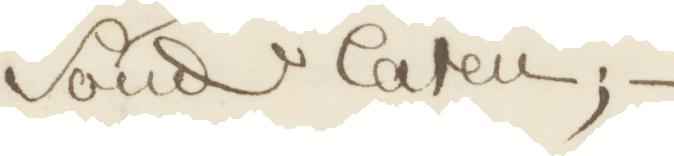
soude laten; —
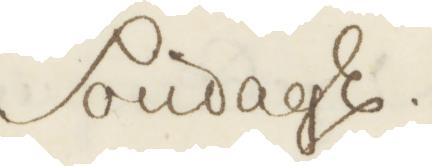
Sondagh.
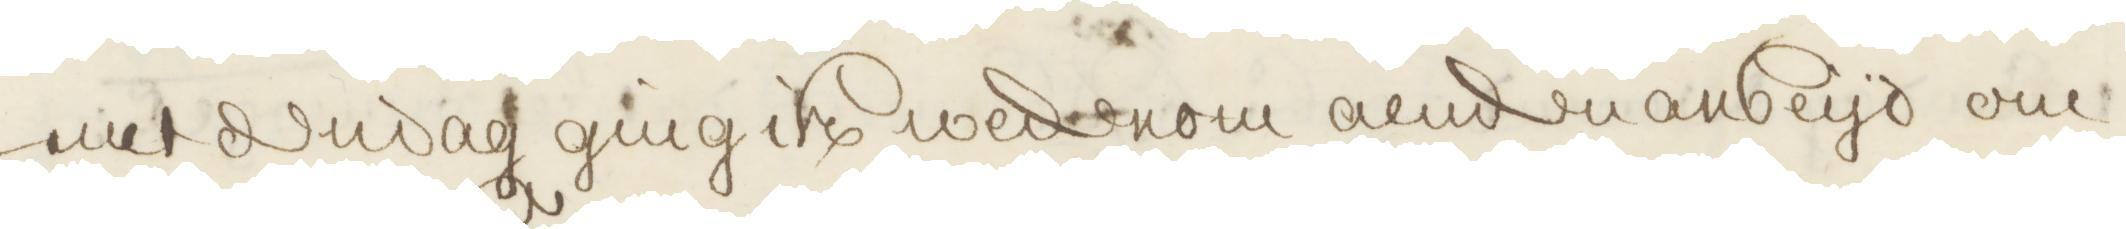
met den dag ging ik wederom aenden arbeijd om
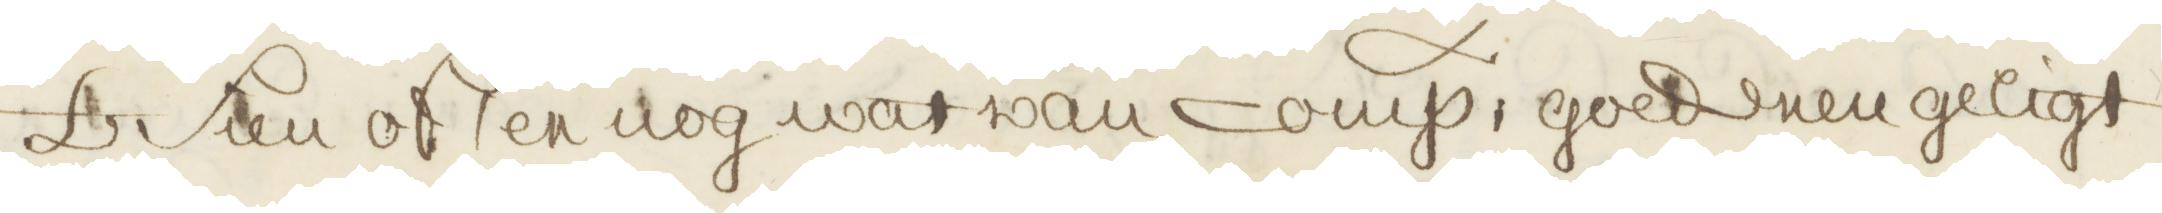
te sien off er nog wat van comp: goederen geligt
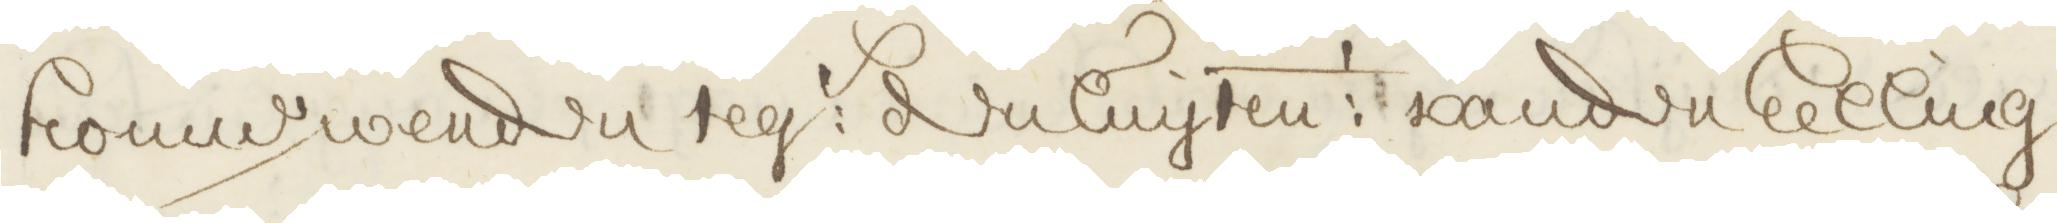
konne werden teg:s den luijten:t vander helling
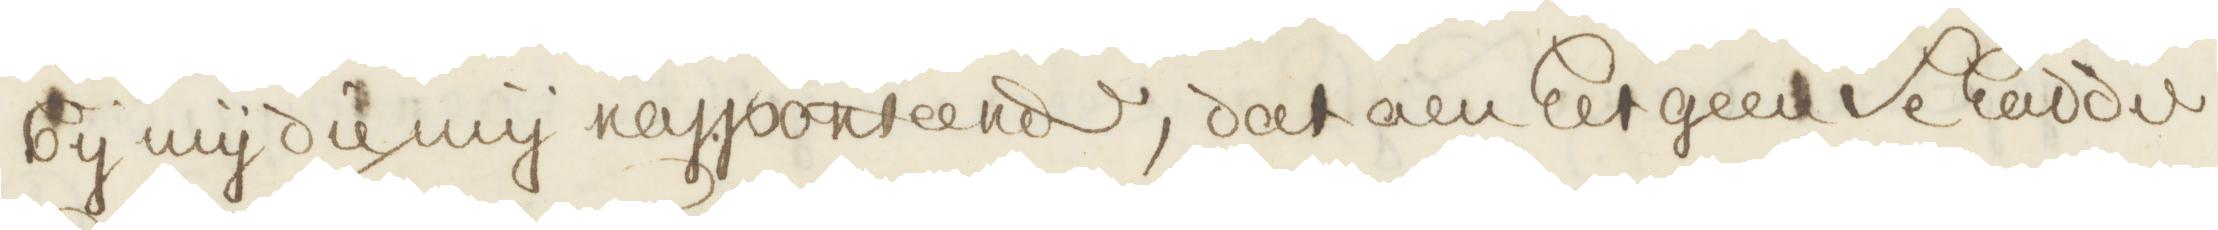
bij mij die mij rapporteerde, dat aen het geen schadde
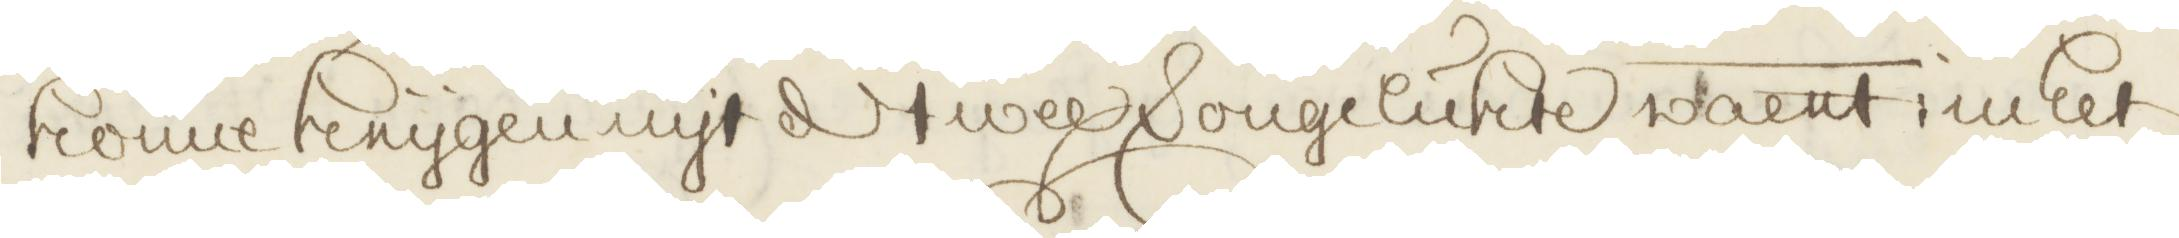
konne krijgen uijt de twee verongelukte waert: in het
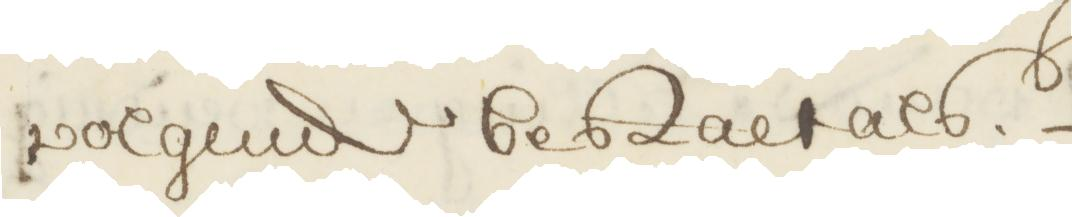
volgende bestaet als. —
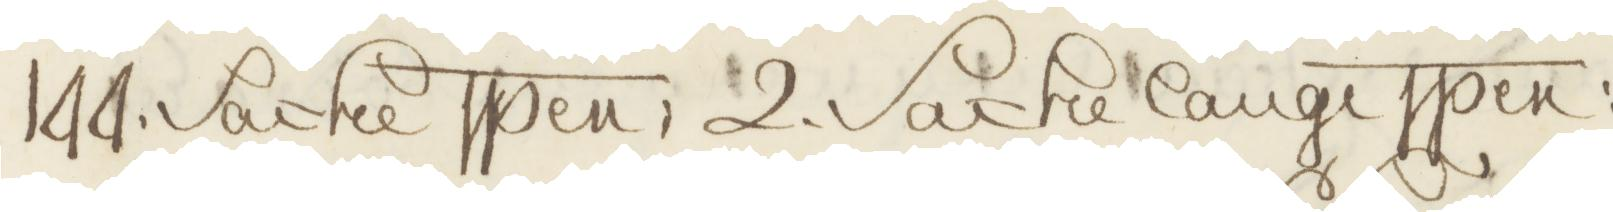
144. Sacke pper: 2. Sacke lange pper
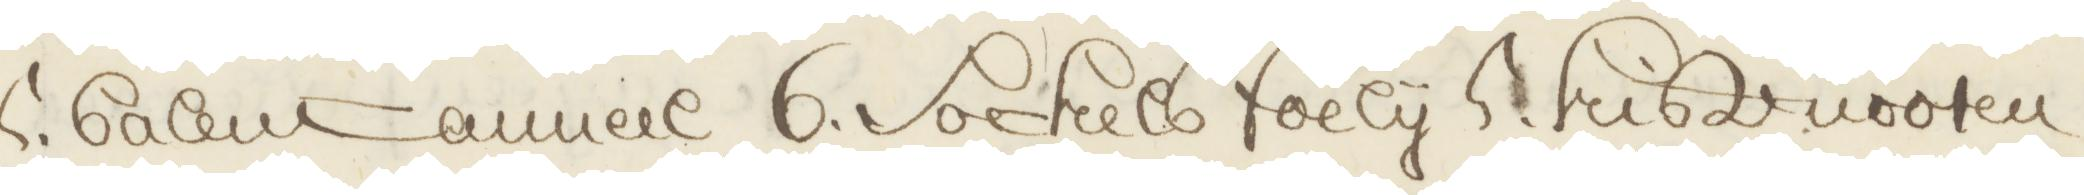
5. balen canneel 6. Sacke ls foelij 5. kiste nooten
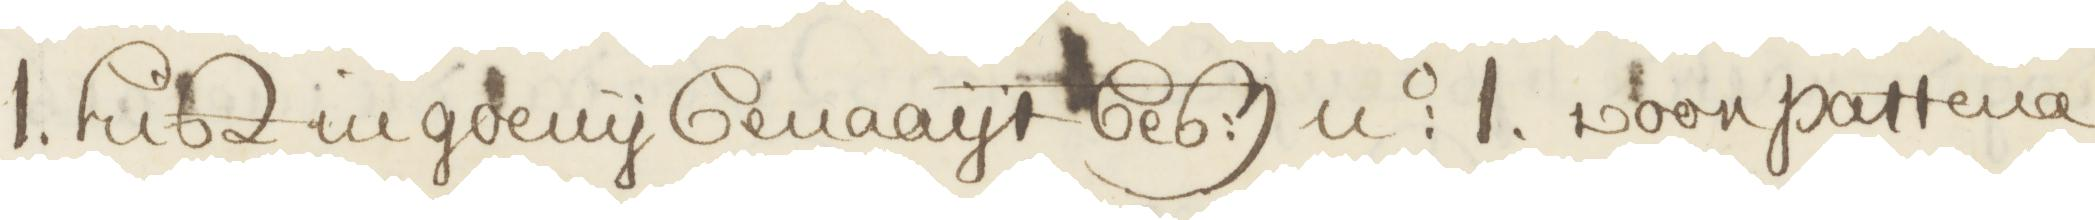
1. kist in goenij benaaijt bes:t n:o 1. voor pattena
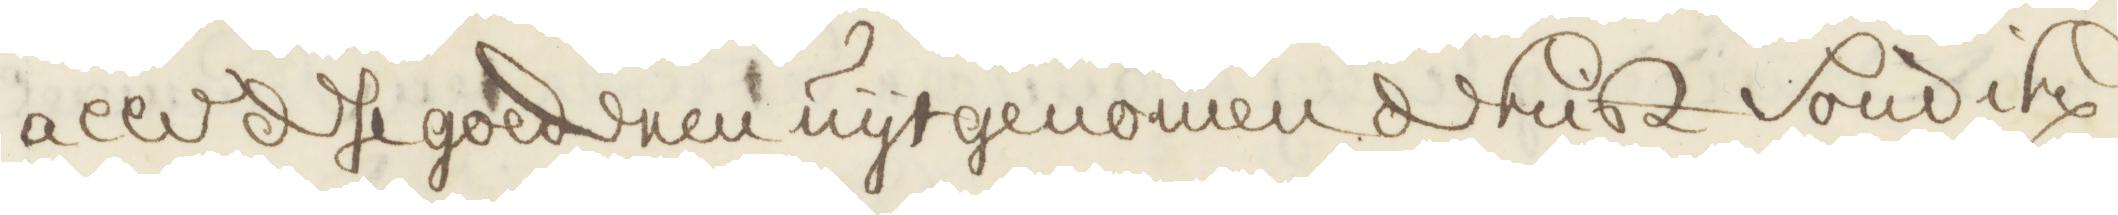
alle dese goederen uijtgenomen de kist soud ik
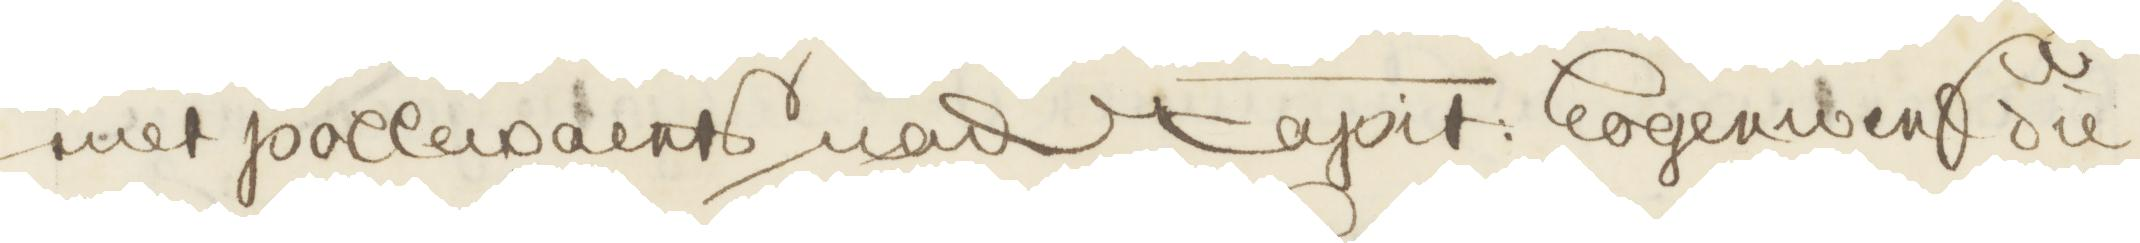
met pollewaerts nade Capit: hogerwerf die
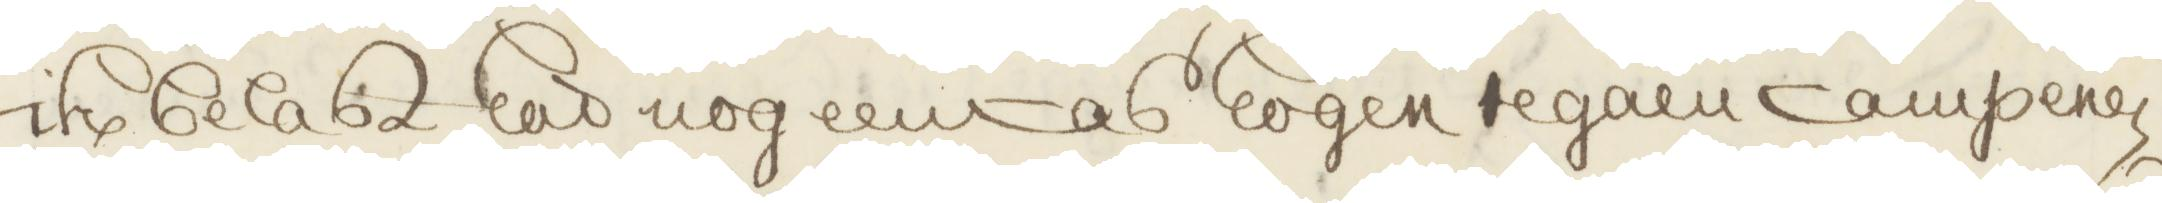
ik belast had nog een cas hoger te gaen camperen
